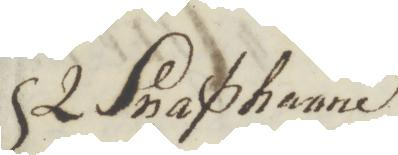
2 Snaphaane
